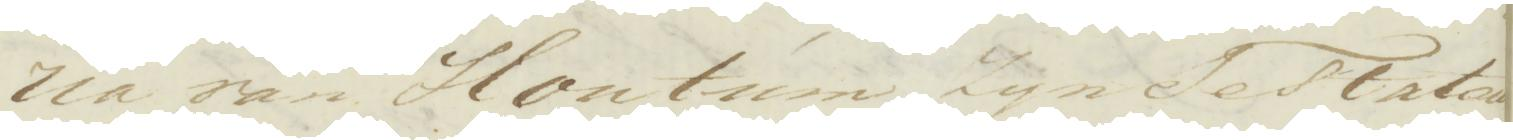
ria van Houtum, zijn Testateu
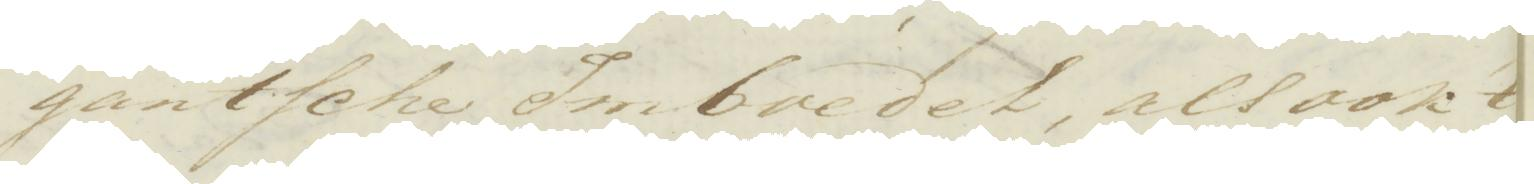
gantsche Imboedel, alsook 't
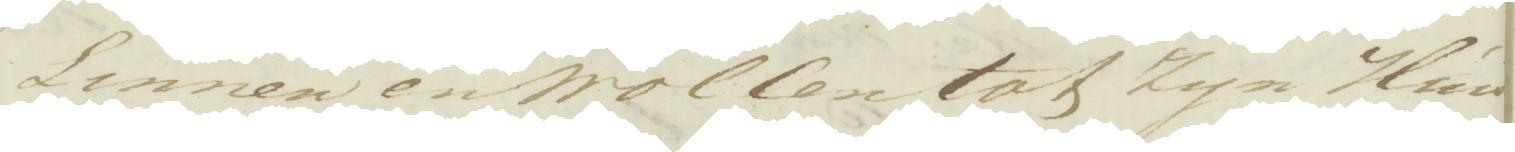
Linnen en wollen tot Zijn Huis
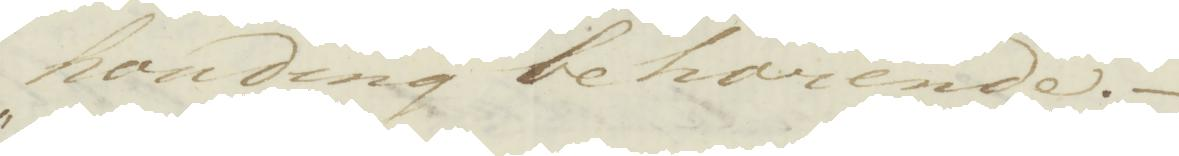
houding behorende.-
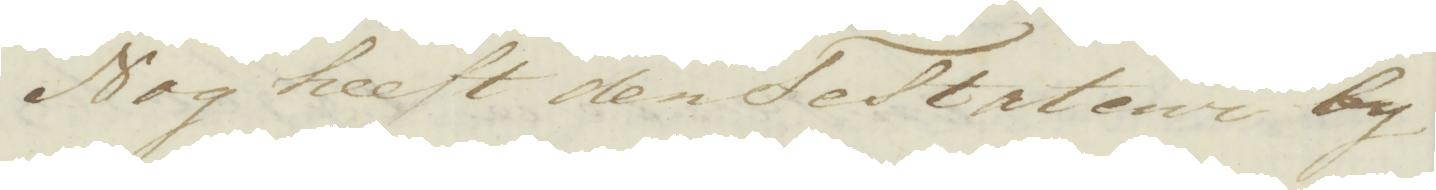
Nog heeft den Testateur by
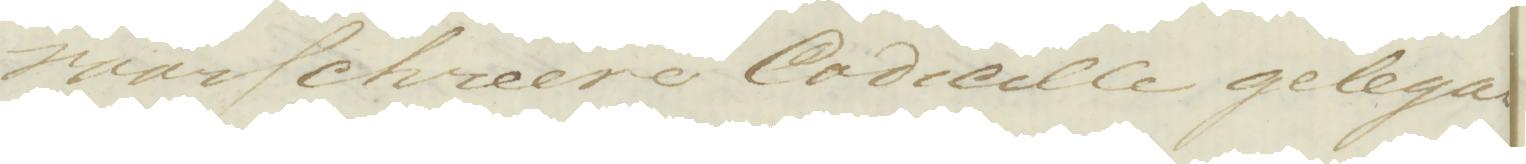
voorschreeve Codicille gelega
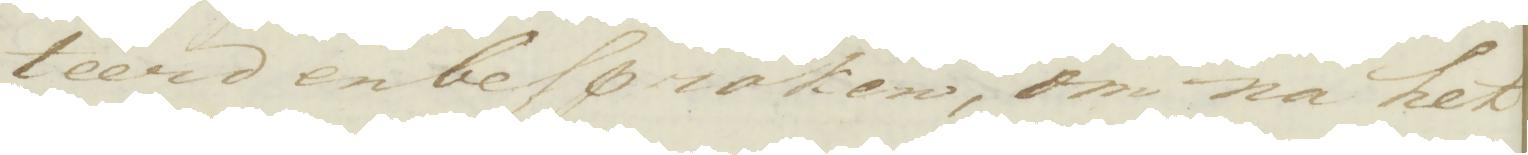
teerd en besproken, om na het
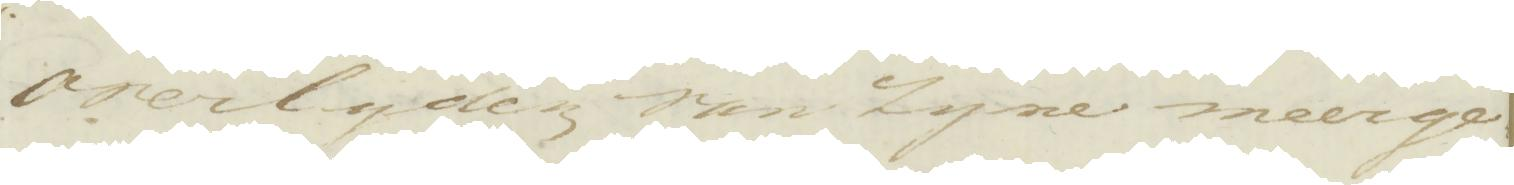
overlijden van Zyne meerge
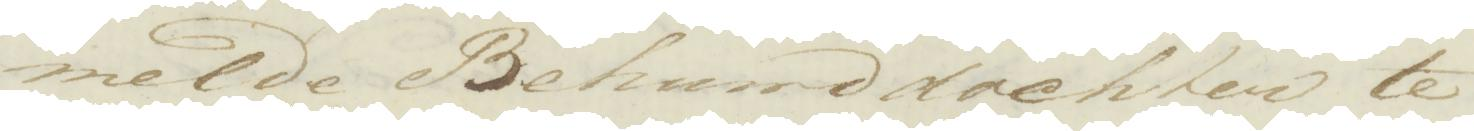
melde Behuwddochter te
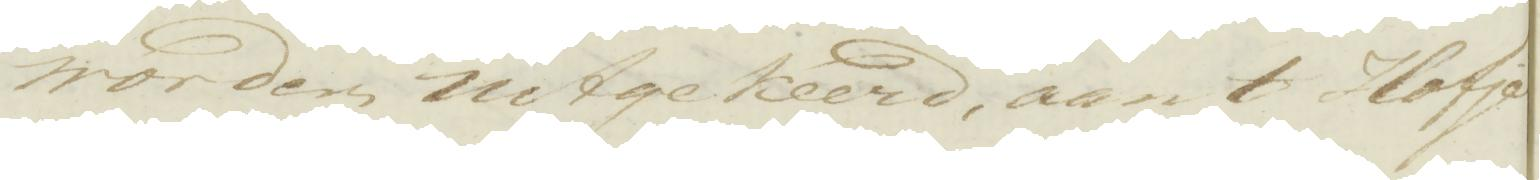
worden uitgekeerd, aan t Hofje
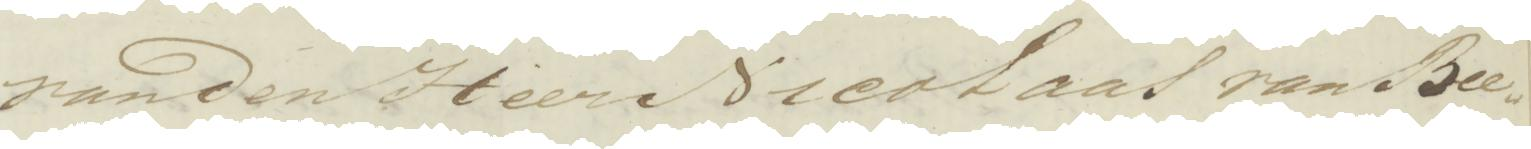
van den Heer Nicolaas van Bee„
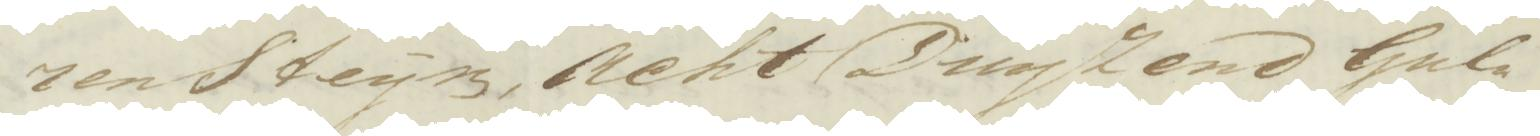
rensteijn, Acht Duijzend Gul
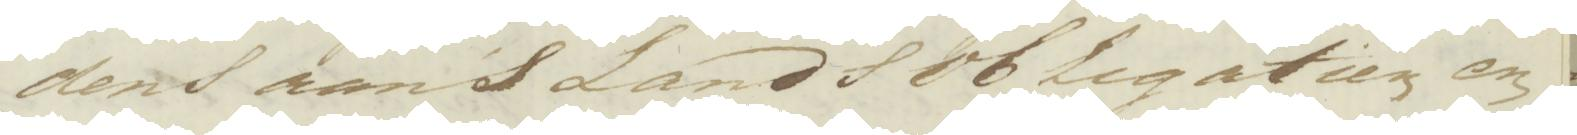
dens aan 'S Lands obligatien en
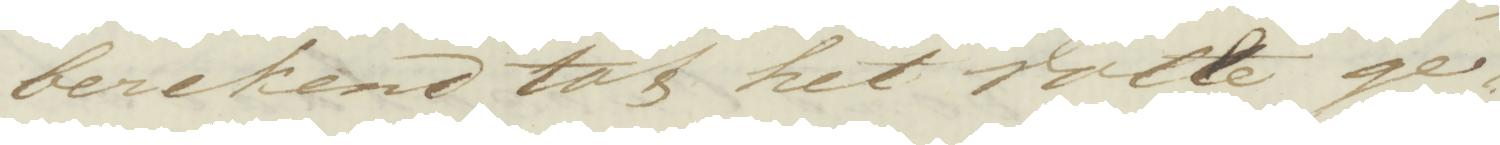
berekend tot het volle ge„
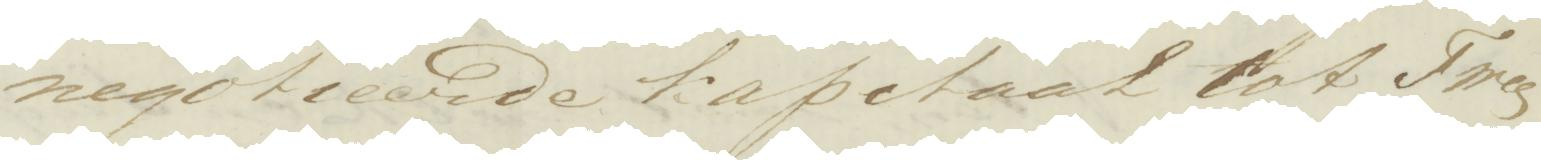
negotieerde kapitaal tot Twee
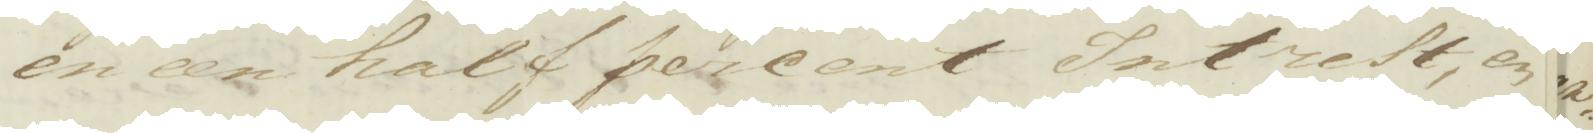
en een half percent Intrest, en
